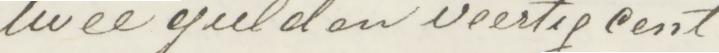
twee gulden veertig cent
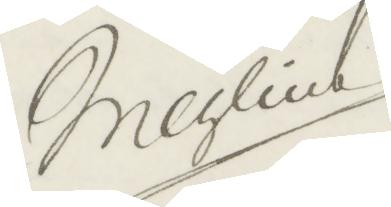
Meglink
